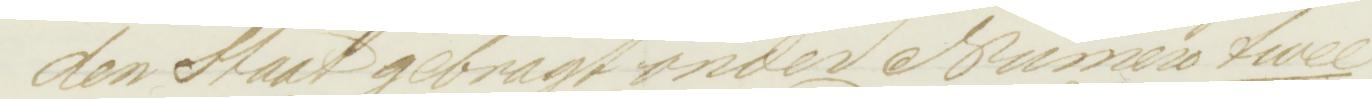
den staat gebragt onder Numero twee
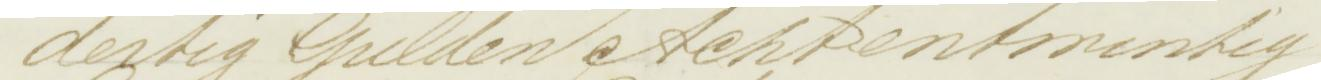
dertig Gulden Acht entwintig
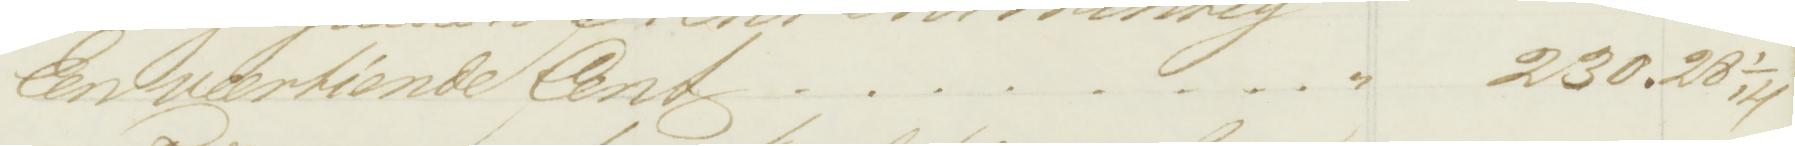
Een veertiende Cent . . . . . . . . „ 230.28 1/14
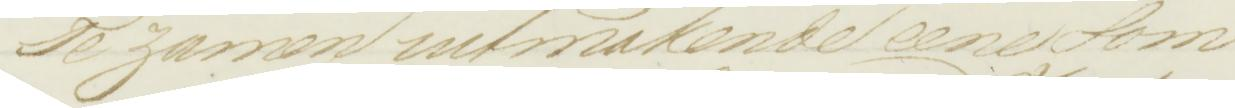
Te zamen uitmakende eene som
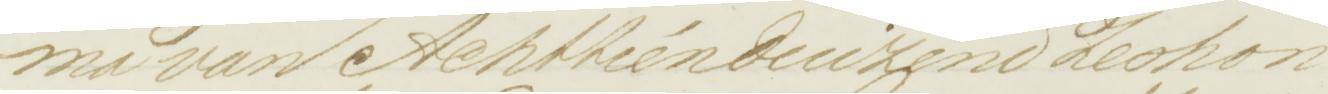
ma van Achttienduizend Zeshon
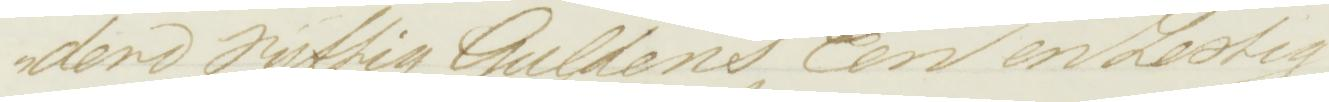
derd Vijftig Guldens Een en Zestig
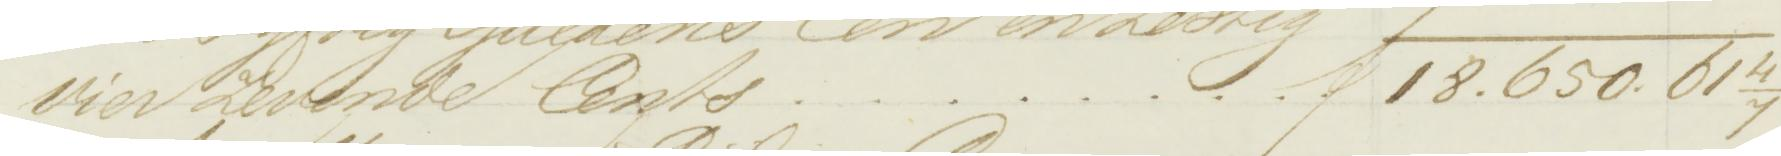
vier Zevende Cents . . . . . . . . ƒ 18.650. 61 4/7
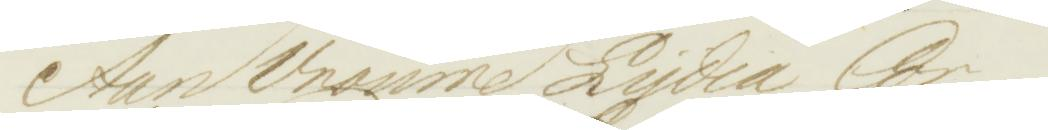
Aan Vrouwe Lijdia Cor=
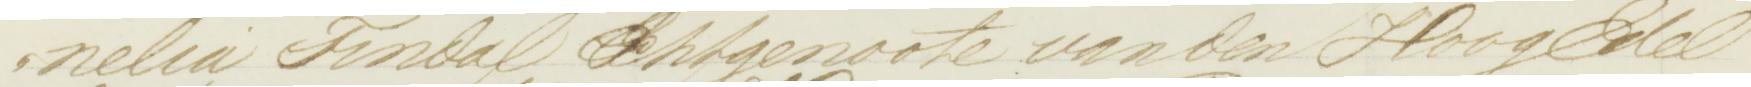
„nelia Tindal Echtgenoote van den HoogEdel
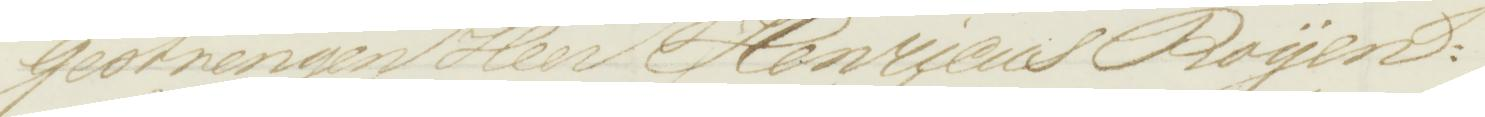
Gestrengen Heer Henricus Roijen:
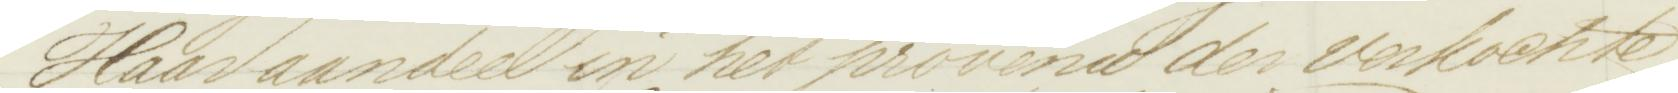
Haar aandeel in het provenu der verkochte
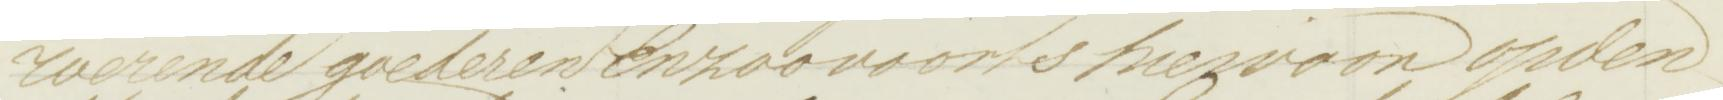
roerende goederen Enzoovoorts hiervoor op den
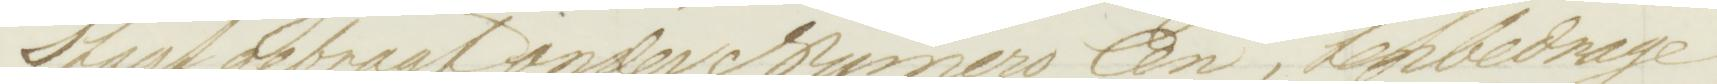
staat gebragt onder Numero Een, tenbedrage
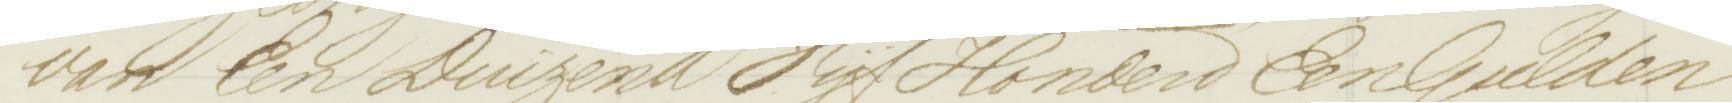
van Een Duizend Vijf Honderd Een Gulden
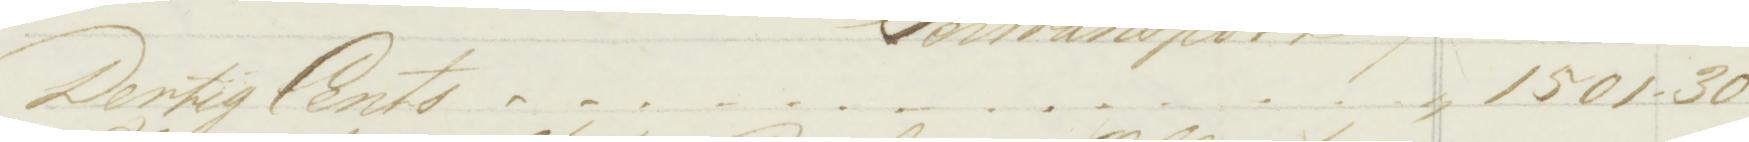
Dertig Cents - - . - - . - . . . . . . . „ 1501.30
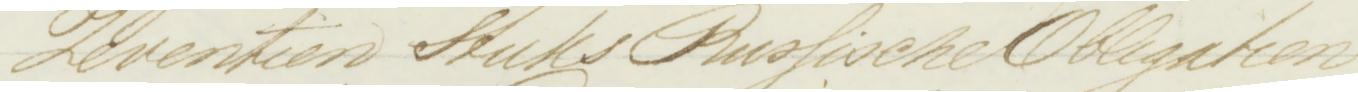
Zeventien stuks Russische Obligatien
